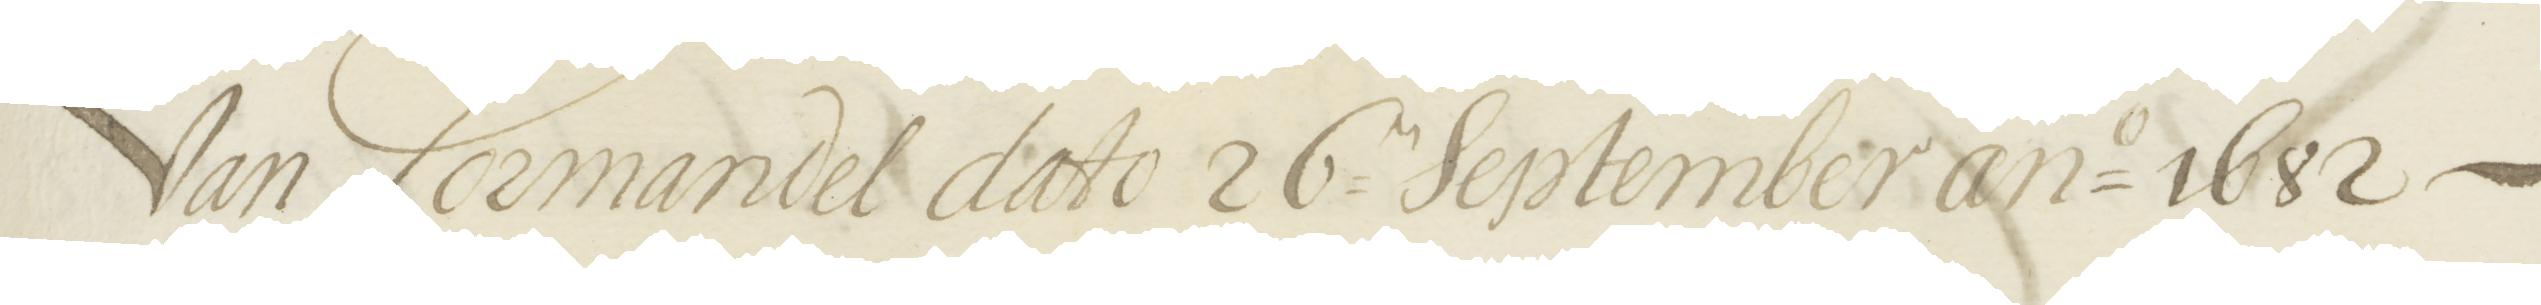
Van Cormandel dato 26:e September an=o 1682 -
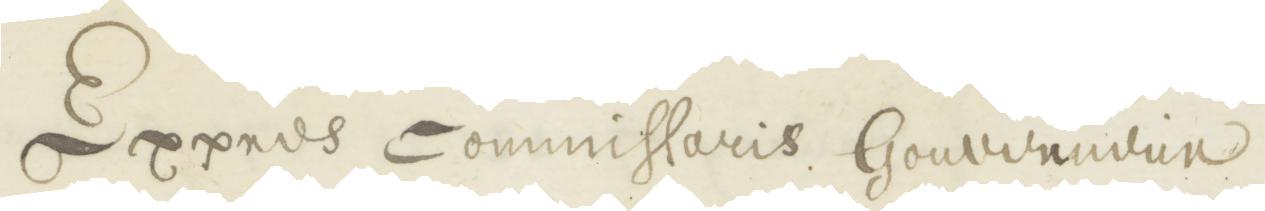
Expres Commissaris Gouverneur
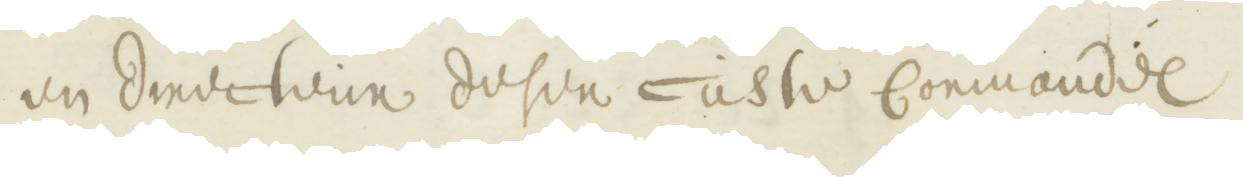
en directeur deser Custe Cormandel
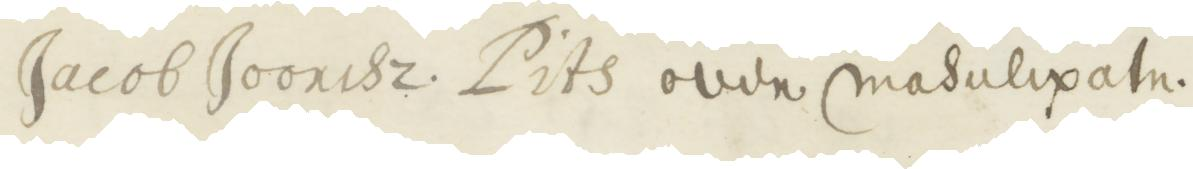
Jacob Joorisz. Pits over masulipatn.
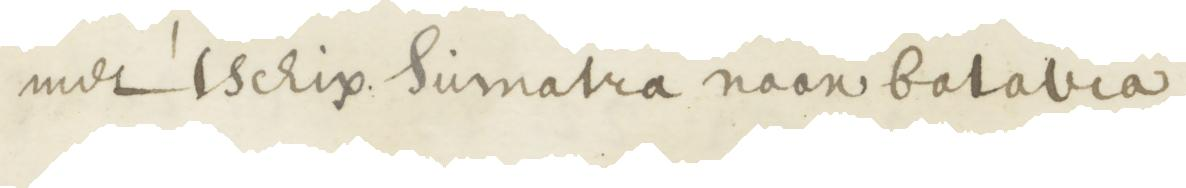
met 't schip Sumatra naar batavia
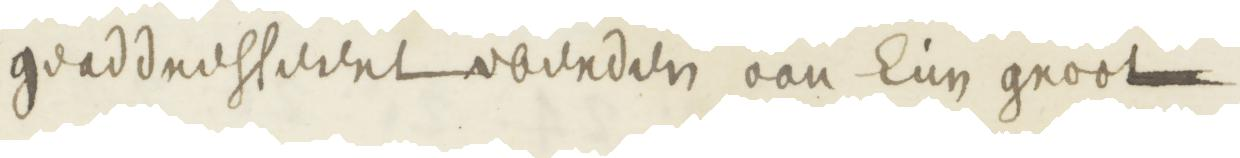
geaddresseert werden aan hun groot
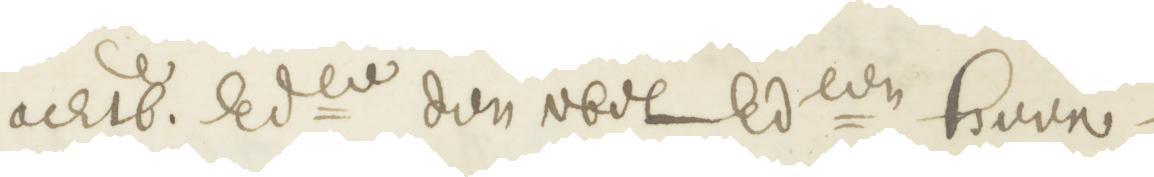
achtb. Ed=le den wel Ed=len heer
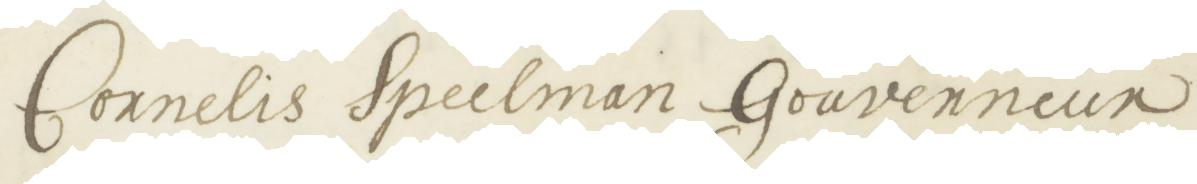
Cornelis Speelman Gouverneur
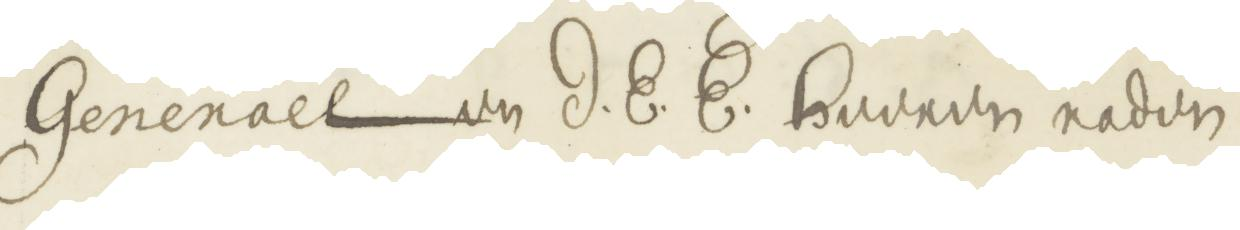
Generael en d. E: E. heeren raden
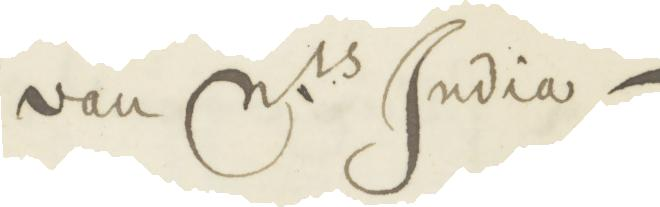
van n„ts Jndia
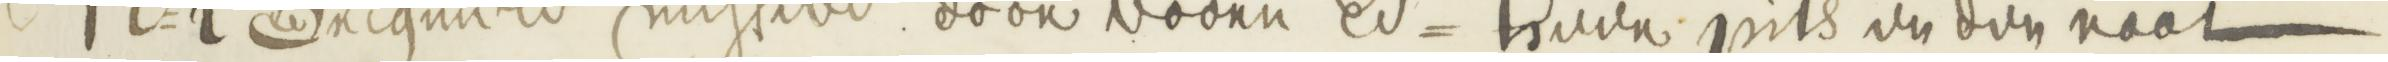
N=o 1 Originele missive door voorn Ed=ln heer pits en den raat
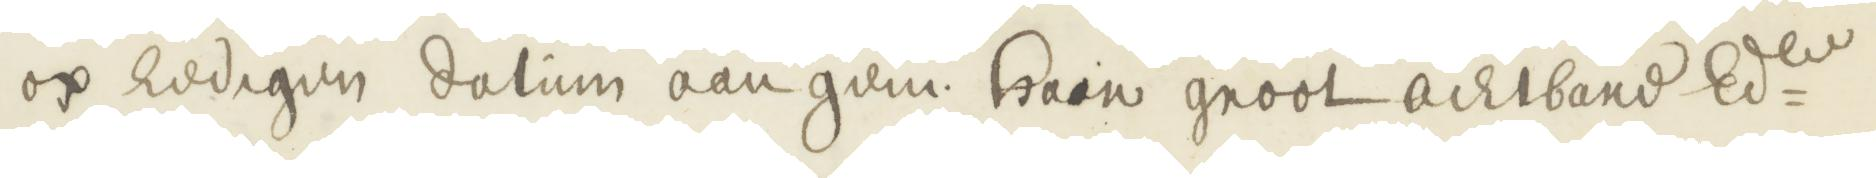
op hedigen datum aan gem:e haar groot achtbare Ed=le
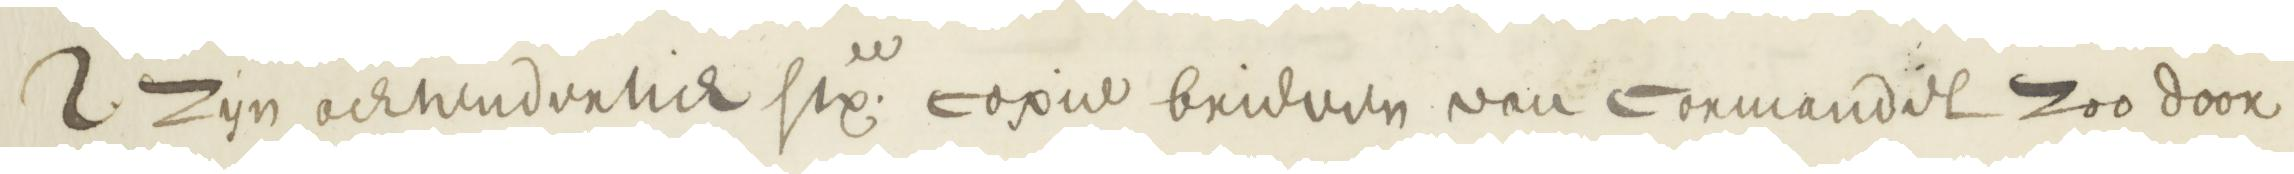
2 Zijn achtendertich stx:e Copie brieven van Cormandel Zoo door
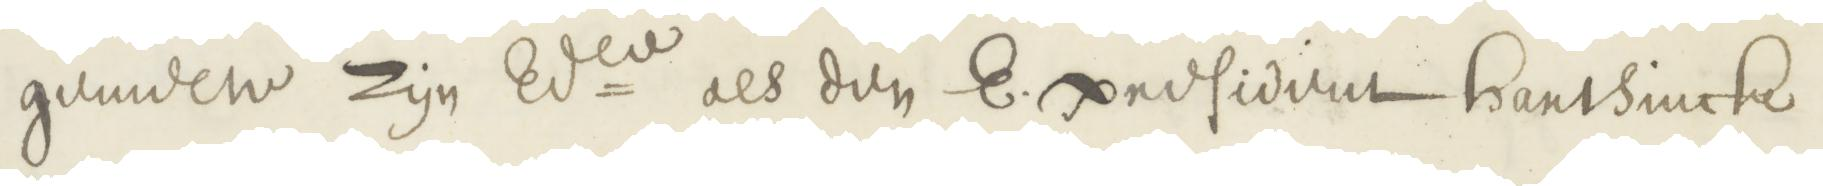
gemelte Zijn Ed=le als den E. president hartsinck
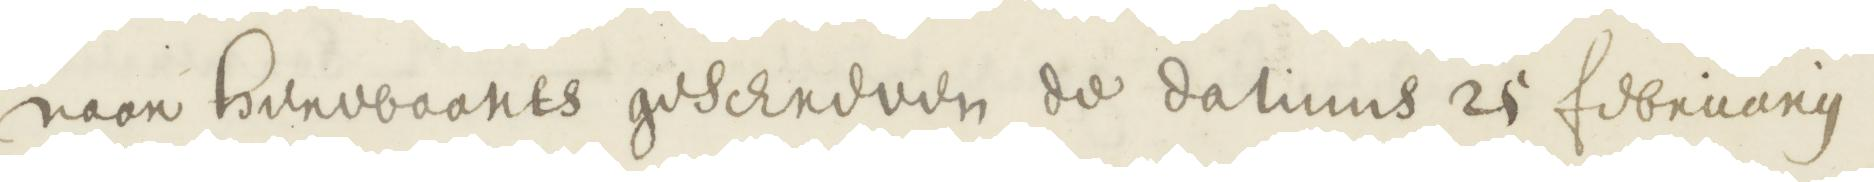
naar herwaarts geschreven de datums 25 februarij
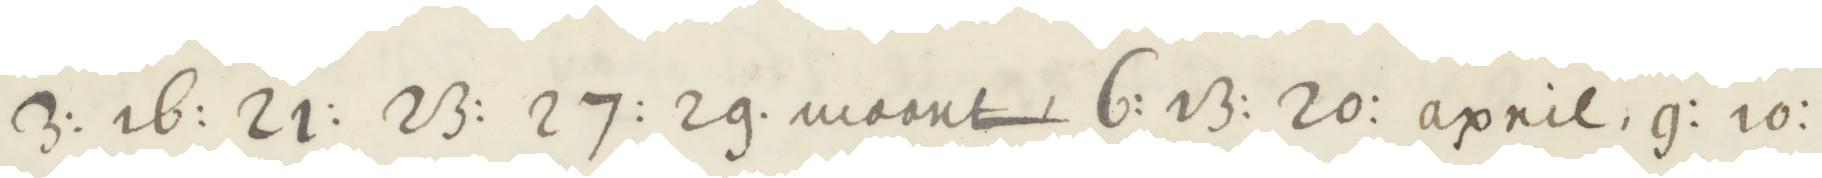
3: 16: 21: 23: 27: 29. moort, 6: 13: 20: april, 9: 10:
